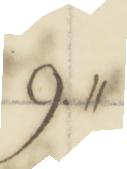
9. „
